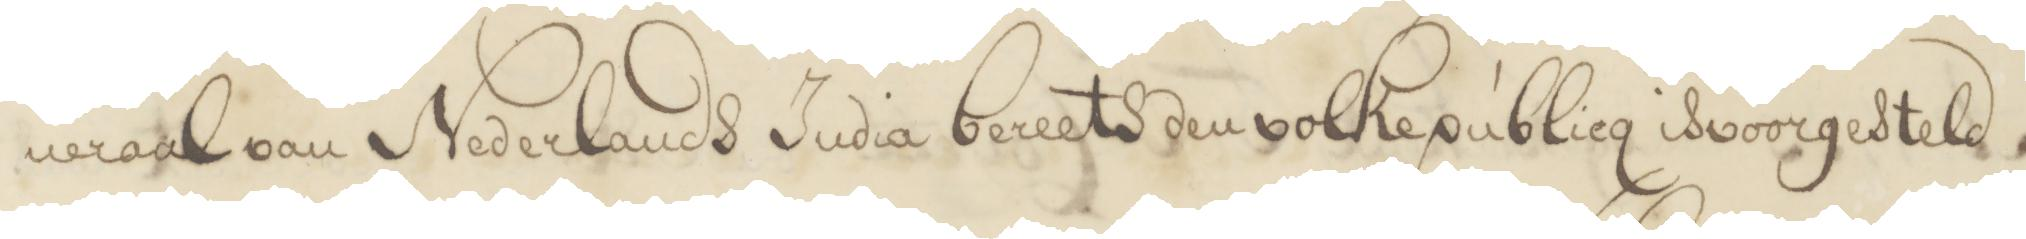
neraal van Nederlands India bereets den volke publicq is voorgesteld
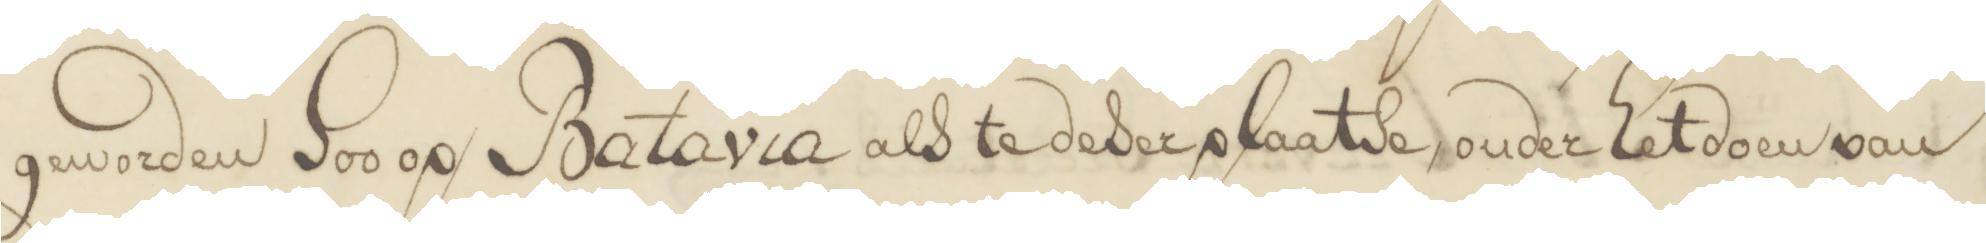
geworden soo op Batavia als te deser plaatse, onder het doen van
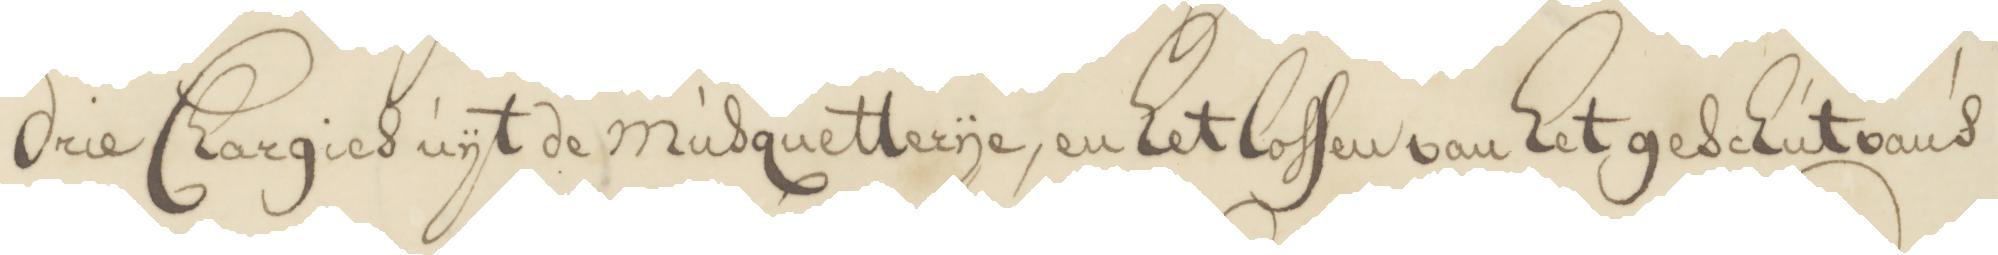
drie Chargies uijt de musquetterije, en het lossen van het geschut van 's
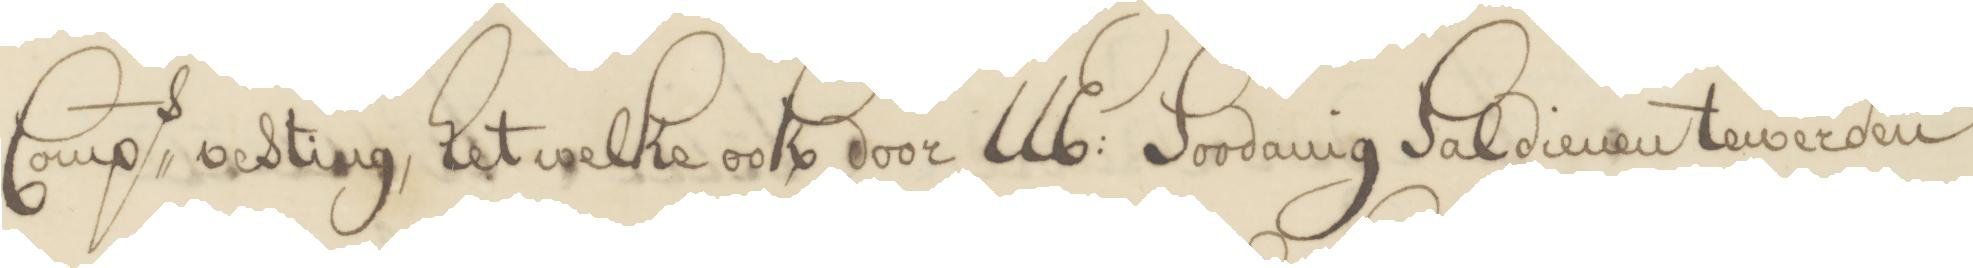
Comp„s vesting, het welke ook door UE: soodanig sal dienen tewerden
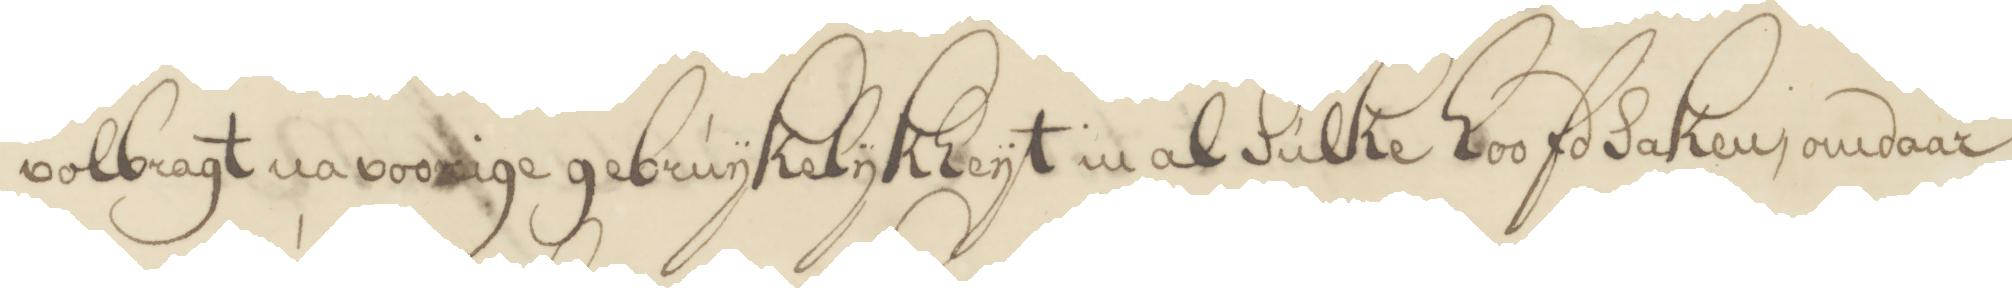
volbragt na voorige gebruijkelijkheijt in al sulke hoofdsaken, omdaar
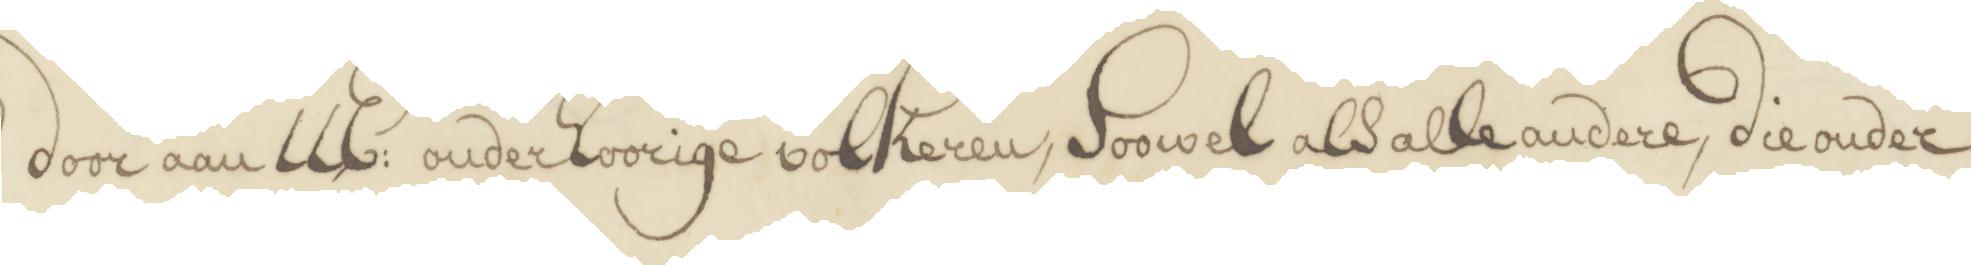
door aan UE: onderhoorige volkeren, soowel als alle andere, die onder
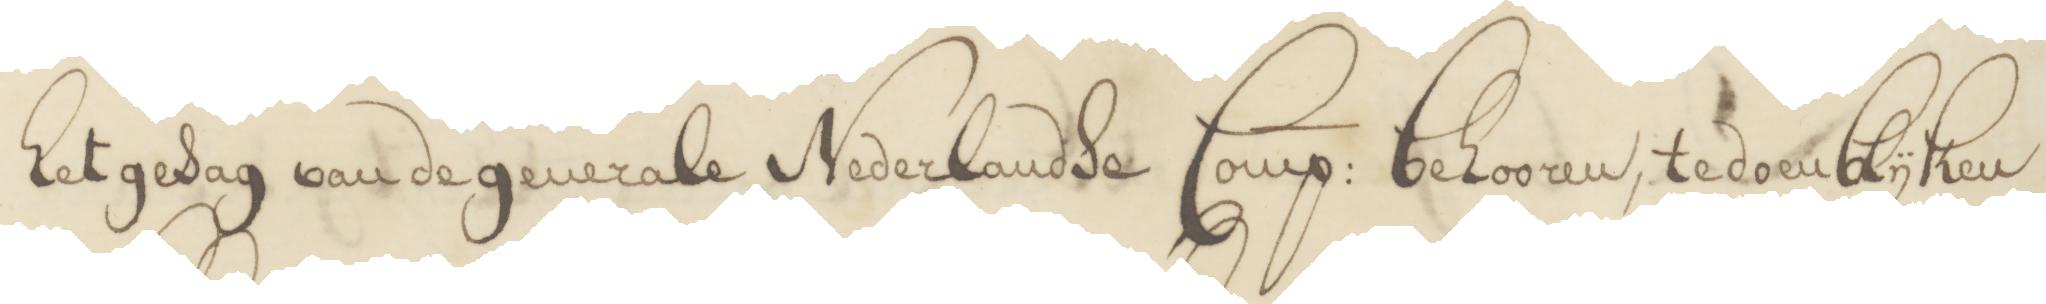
het gesag van de generale Nederlandse Comp: behooren, te doen blijken
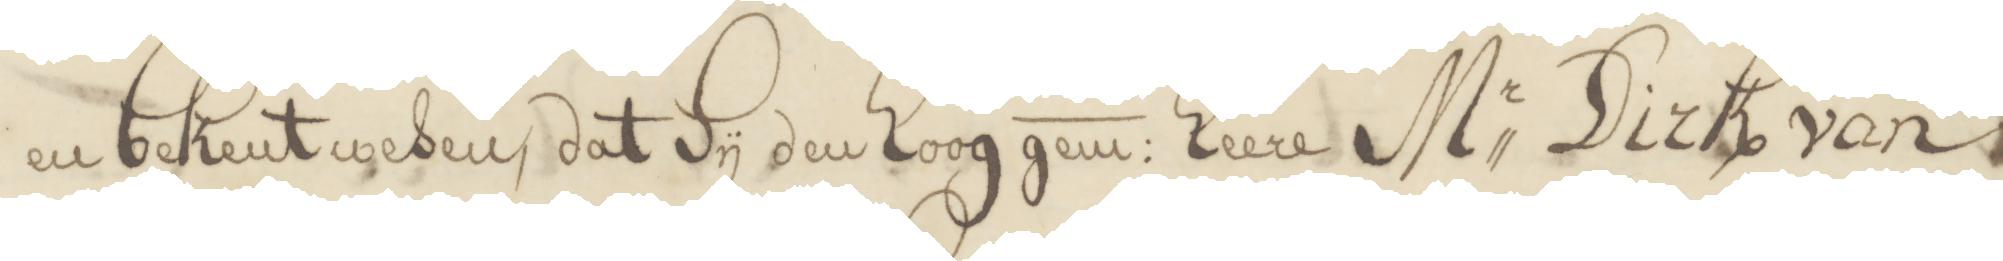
en bekent wesen, dat sij den hoog gem: heere M„r Dirk van
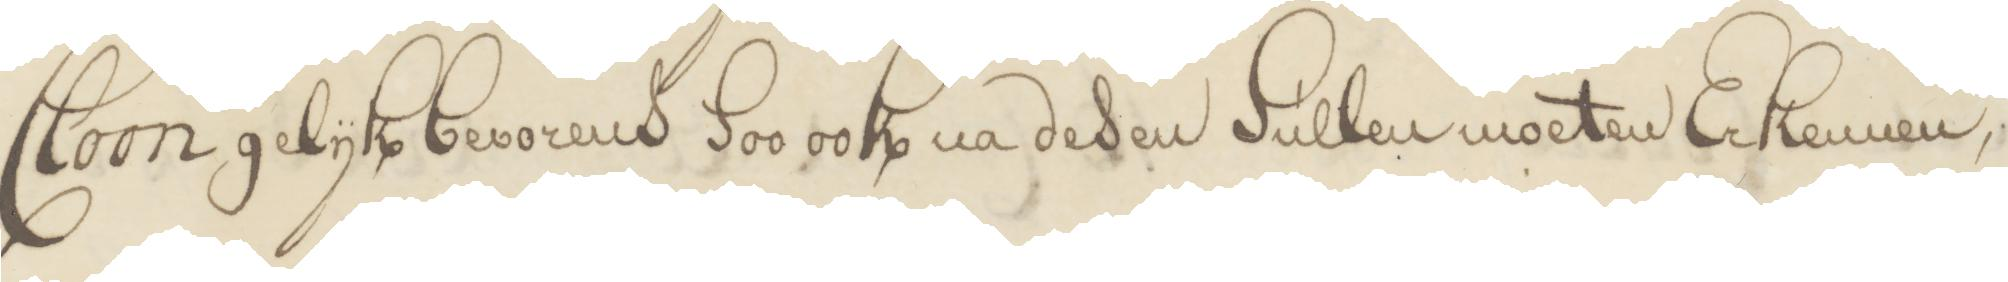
Cloon gelijk bevorens soo ook na desen sullen moeten Erkennen,
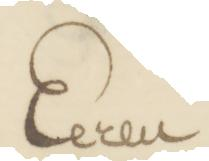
Eeren
